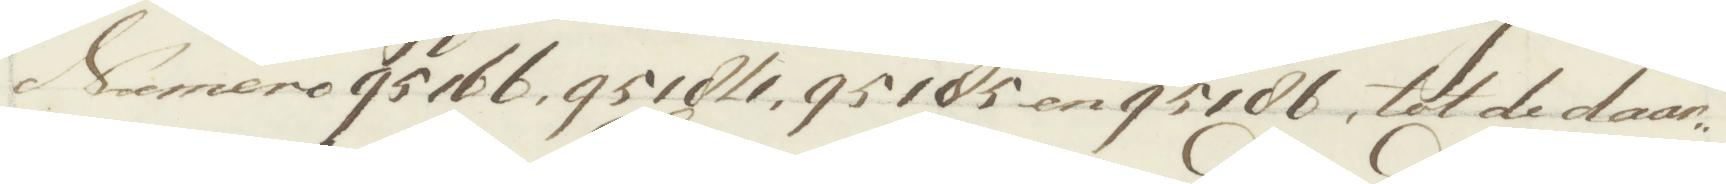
Numero 95166, 95184, 95185 en 95186, tot de daar„
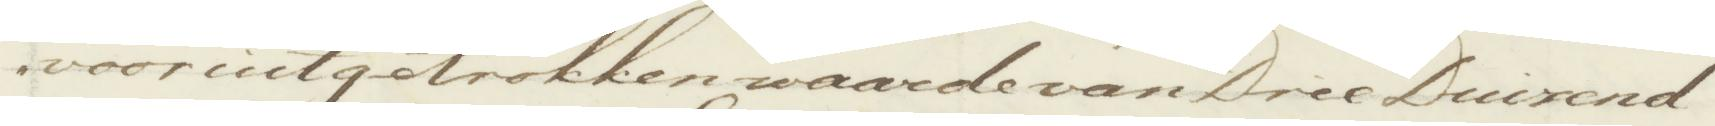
„voor uitgetrokken waarde van Drie Duizend
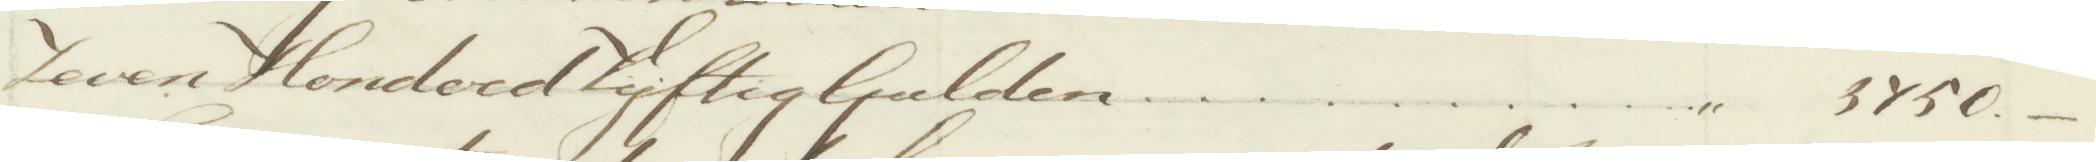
Zeven Honderd Vijftig Gulden . . . . . . . . . . . „ 3750. —
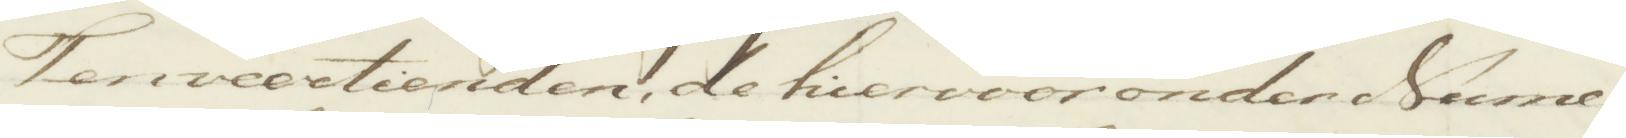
Ten veertienden, de hiervoor onder Nume
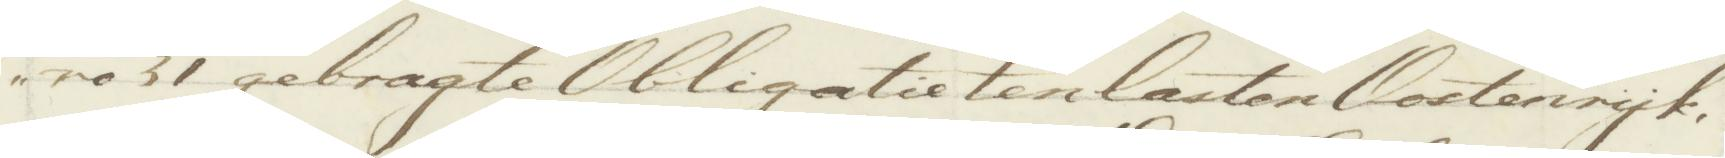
„ro 31 gebragte Obligatie ten lasten Oostenrijk,
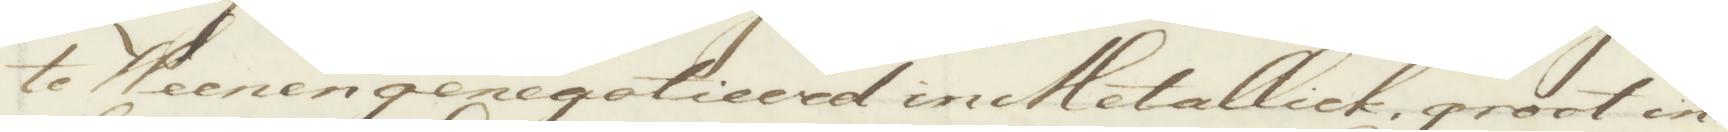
te Weenen genegotieerd in Metalliek, groot in
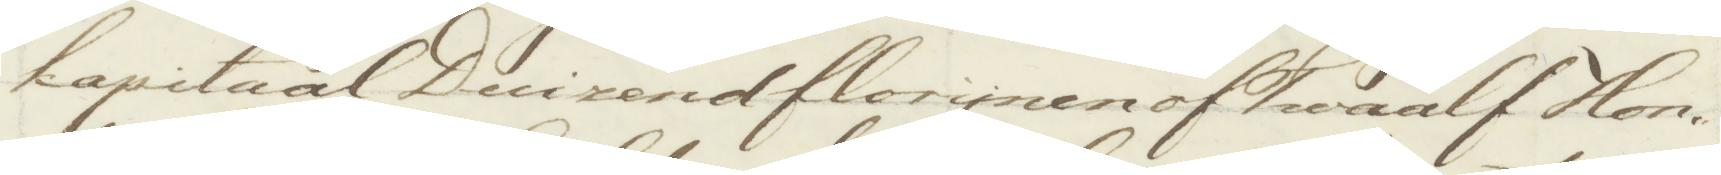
kapitaal Duizend florijnen of Twaalf Hon„
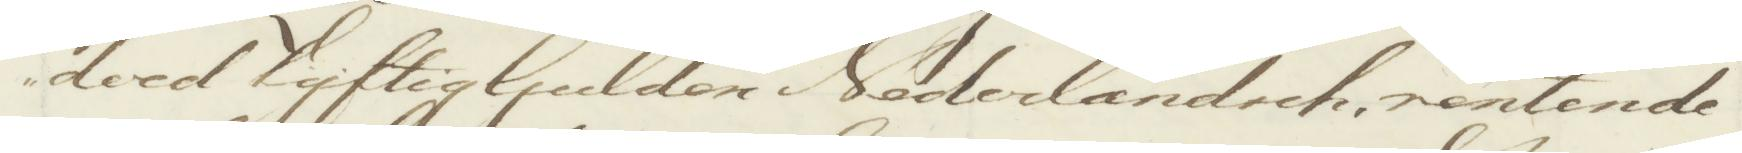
„derd Vijftig Gulden Nederlandsch, rentende
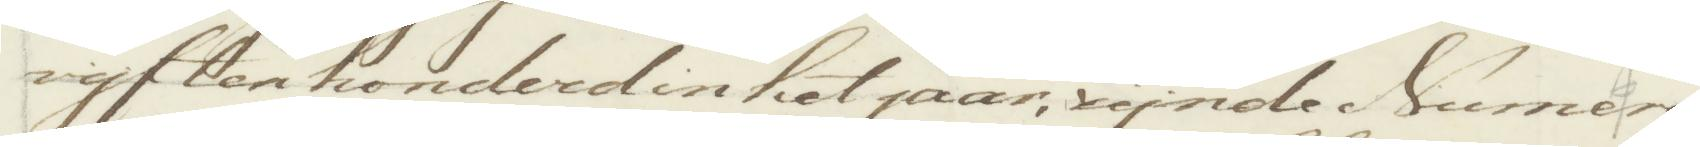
vijf ten honderd in het jaar, zijnde Nume|ro
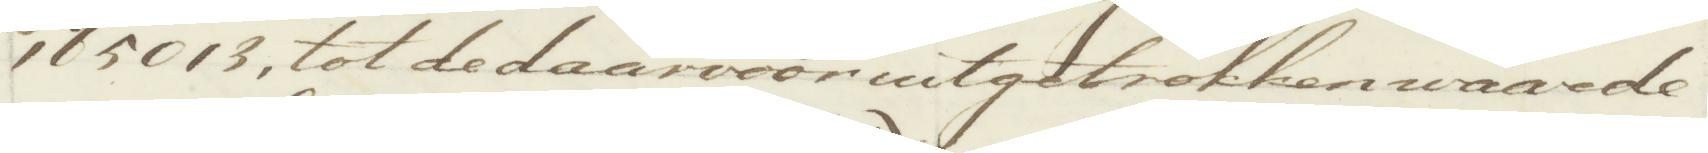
165013, tot de daarvoor uitgetrokken waarde
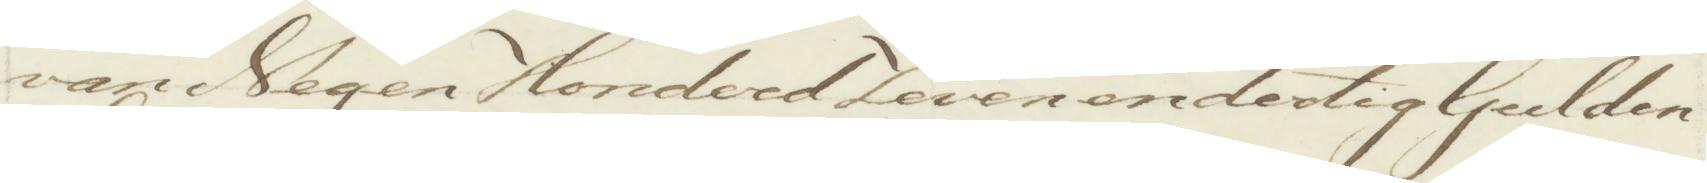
van Negen Honderd Zeven en dertig Gulden
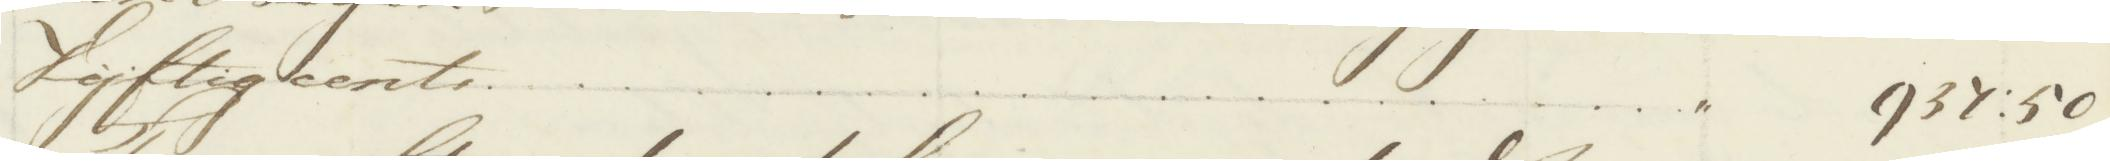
Vijftig cents. . . . . . . . . . . . . . . . . . . . . . . „ 937: 50
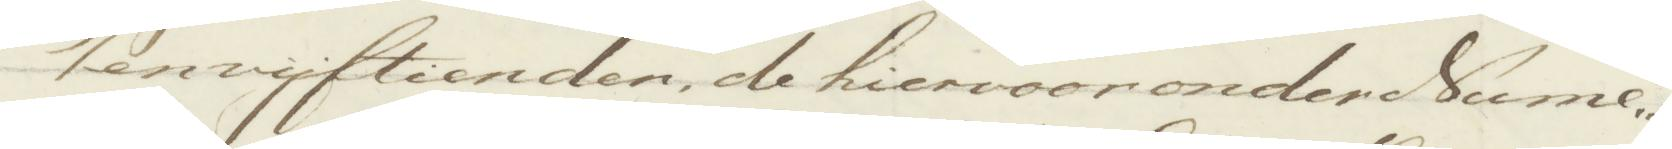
Ten vijftienden, de hiervoor onder Nume„
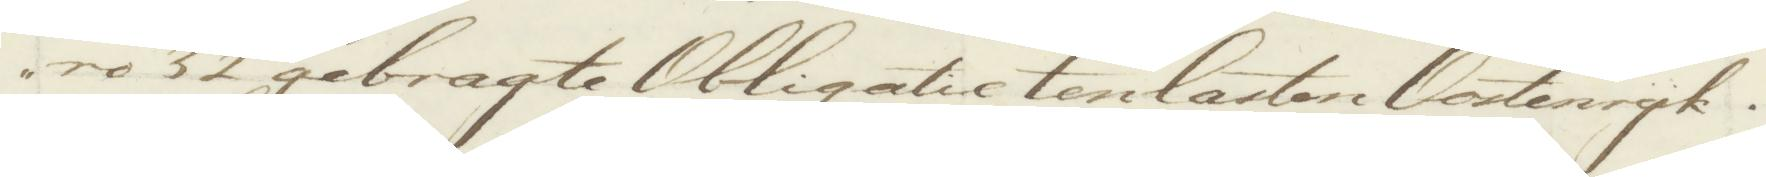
„ro 32 gebragte Obligatie ten lasten Oostenrijk.
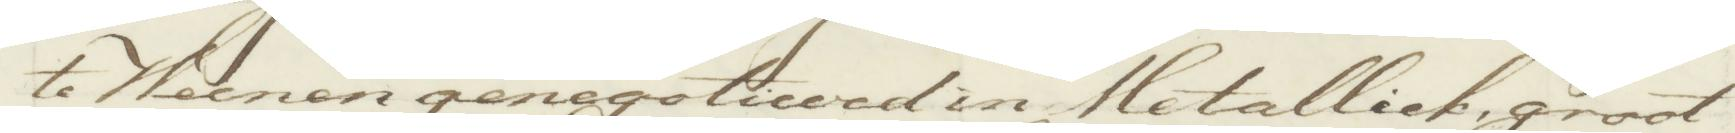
te Weenen genegotieerd in Metalliek, groot
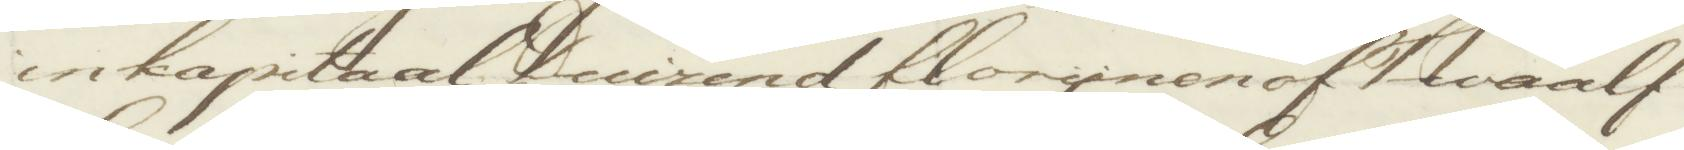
in kapitaal Duizend florijnen of Twaalf
